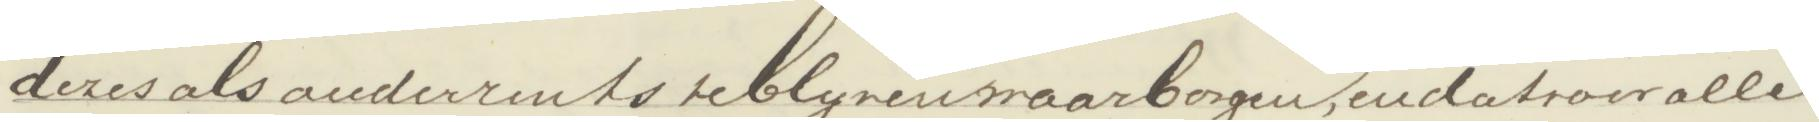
dezes als anderzints te blyven waarborgen, en datvoor alle
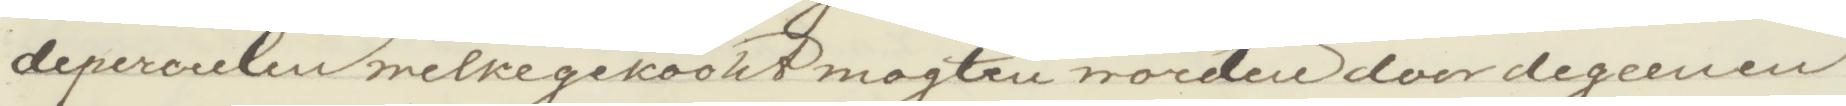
de perceelen welke gekocht mogten worden door degeenen
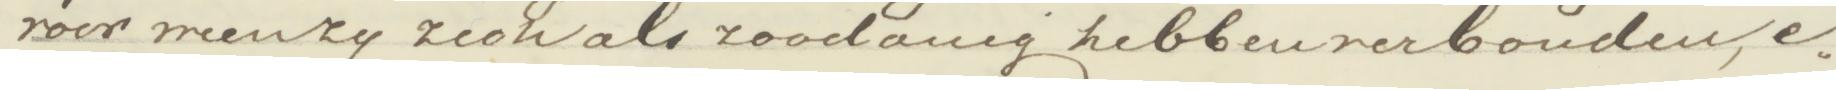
voor wien zy zich als zoodanig hebben verbonden, e„
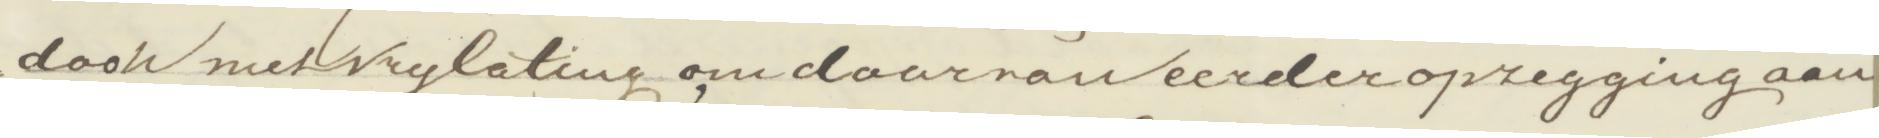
doch met vrylating om daarvan eerder opzegging aan
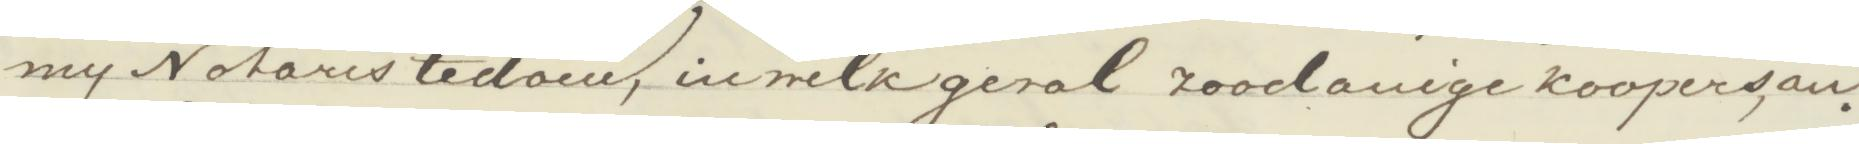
my Notaris te doen, in welk geval zoodanige koopers, an„
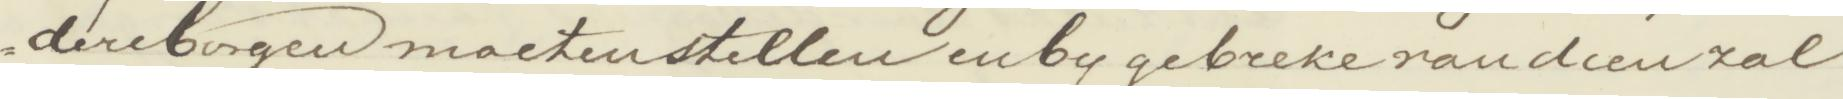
=dere borgen moeten stellen enby gebreke van dien zal
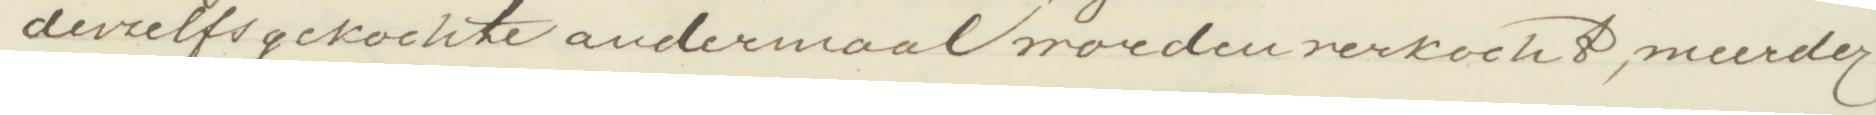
derzelfs gekochte andermaal worden verkocht, meerder
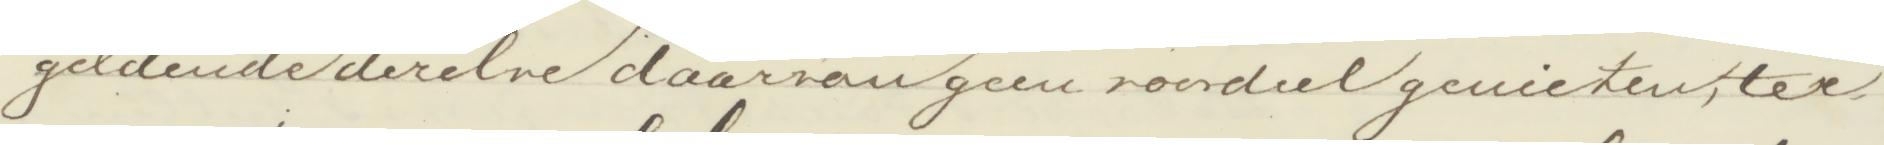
geldende dezelve daarvan geen voordeel genieten, ter
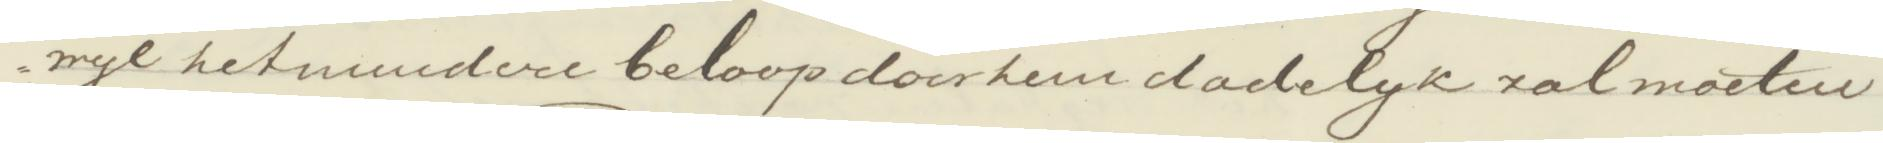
=wyl het mindere beloop door hem dadelyk zal moeten
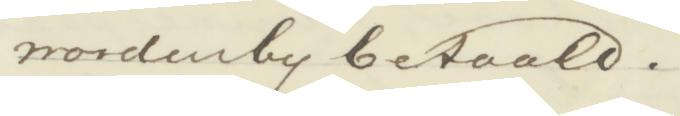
worden by betaald.
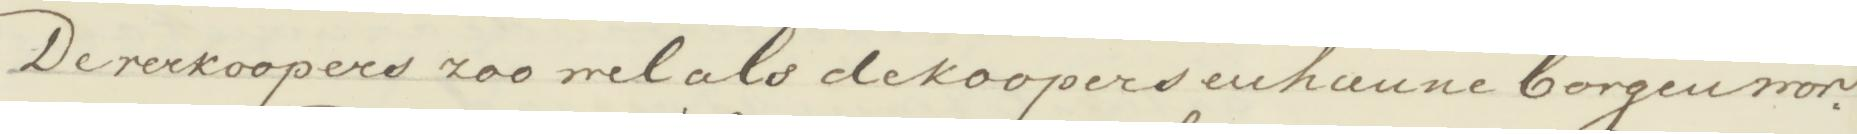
De verkoopers zoo wel als de koopers en hunne borgen wor„
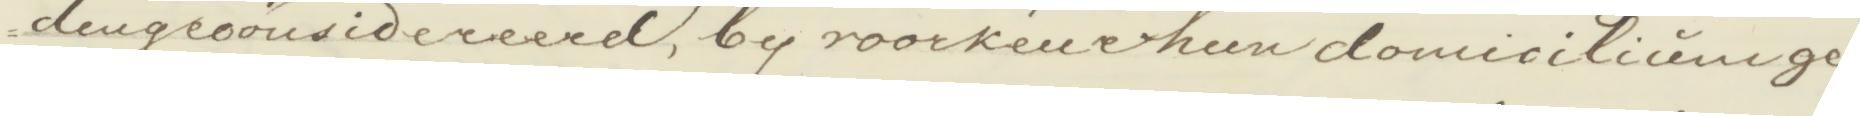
„den geconsidereerd, by voorkeur hun domicilium ge.
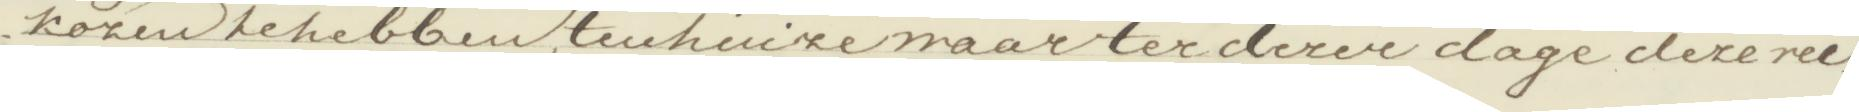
„kozen te hebben, ten huize waar ter dezer dage deze vei
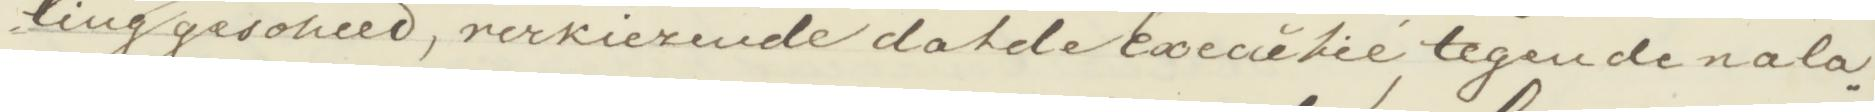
„ling geschied, verkiezende dat de Executie tegen de nala„
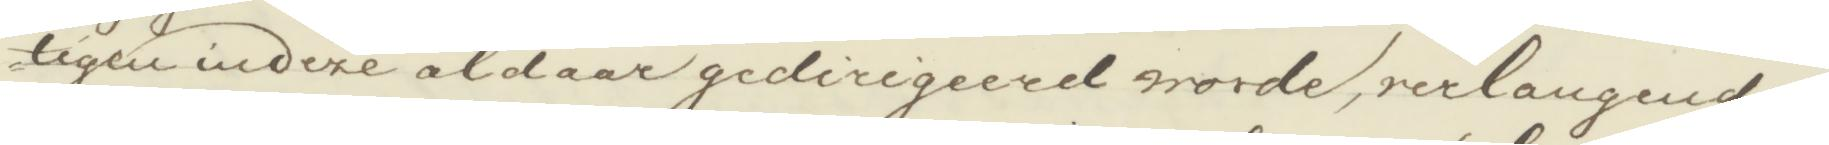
tigen indeze aldaar gedirigeerd worde, verlangende
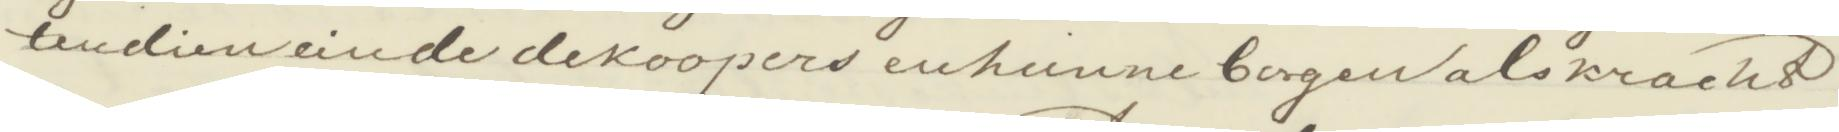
tendien einde de koopers en hunne borgen als kracht
